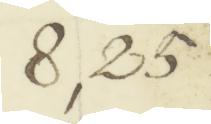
8,25
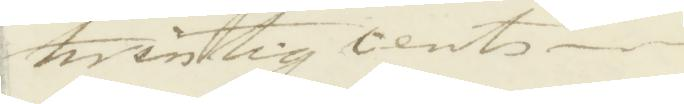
twintig Cents—
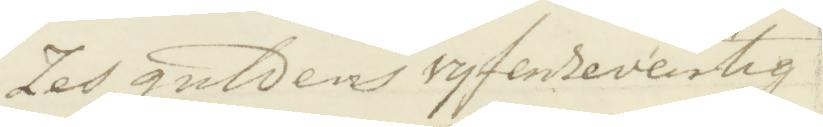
Zes guldens vyfenzeventig
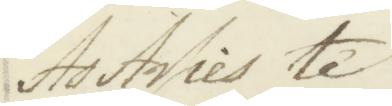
As Aries te
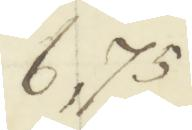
6,75
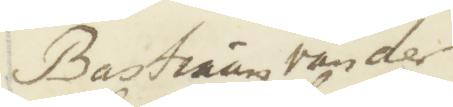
Bastiaan van der
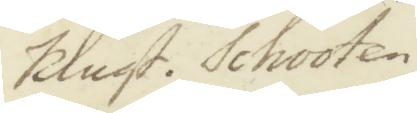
Klugt. Schooten
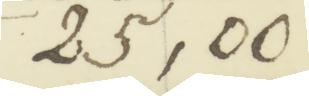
25,00
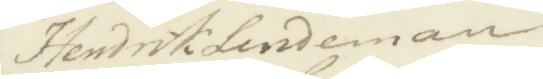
Hendrik Lindeman
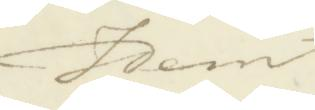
Jdem
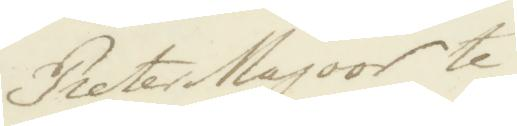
Pieter Majoor te
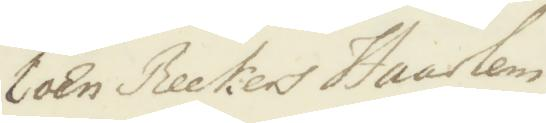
Coen Reekers Haarlem
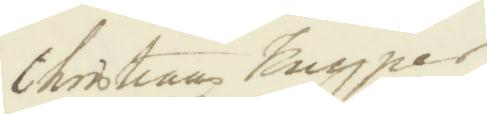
Christiaan Kuyper
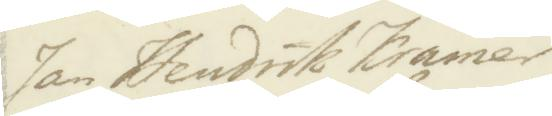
Jan Hendrik Kramer
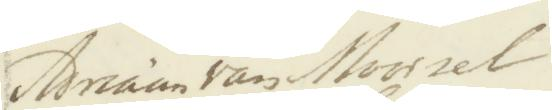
Adriaan van Moorsel
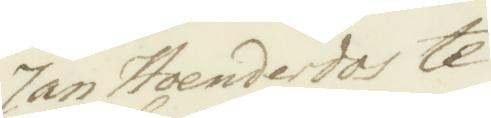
Jan Hoenderdos te
